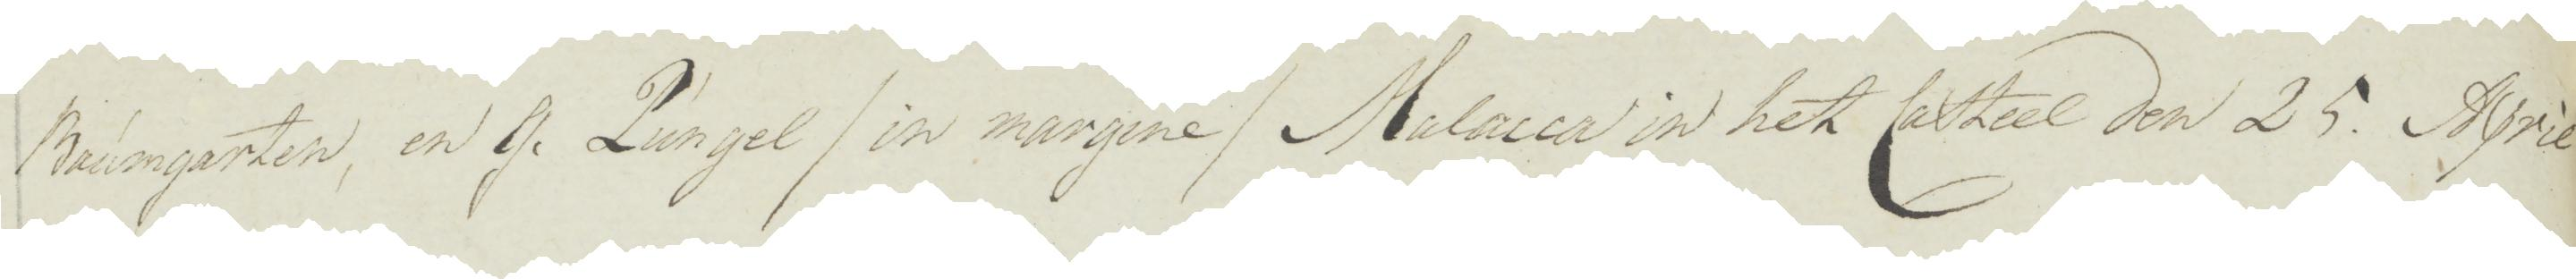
Baumgarten, en G. Pungel / in margine/ Malacca in het Casteel den 25. April
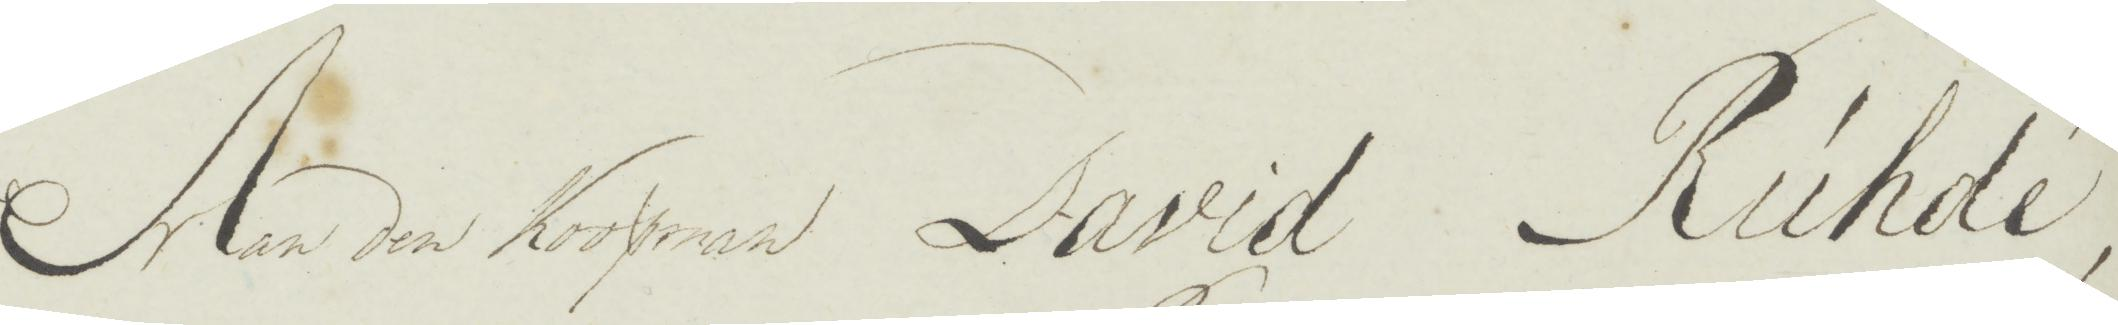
Aan den koopman David Ruhdé,
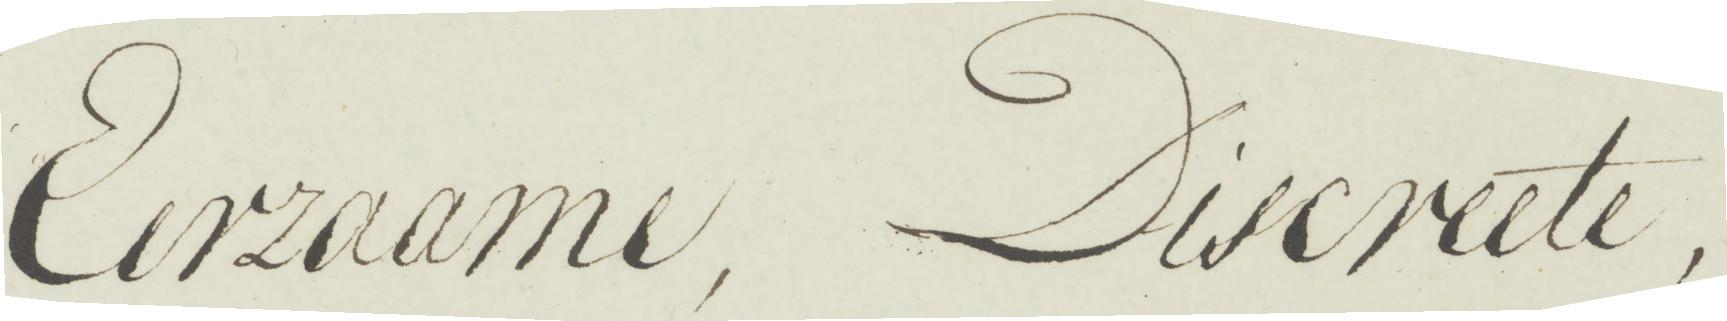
Eerzaame, Discreete,
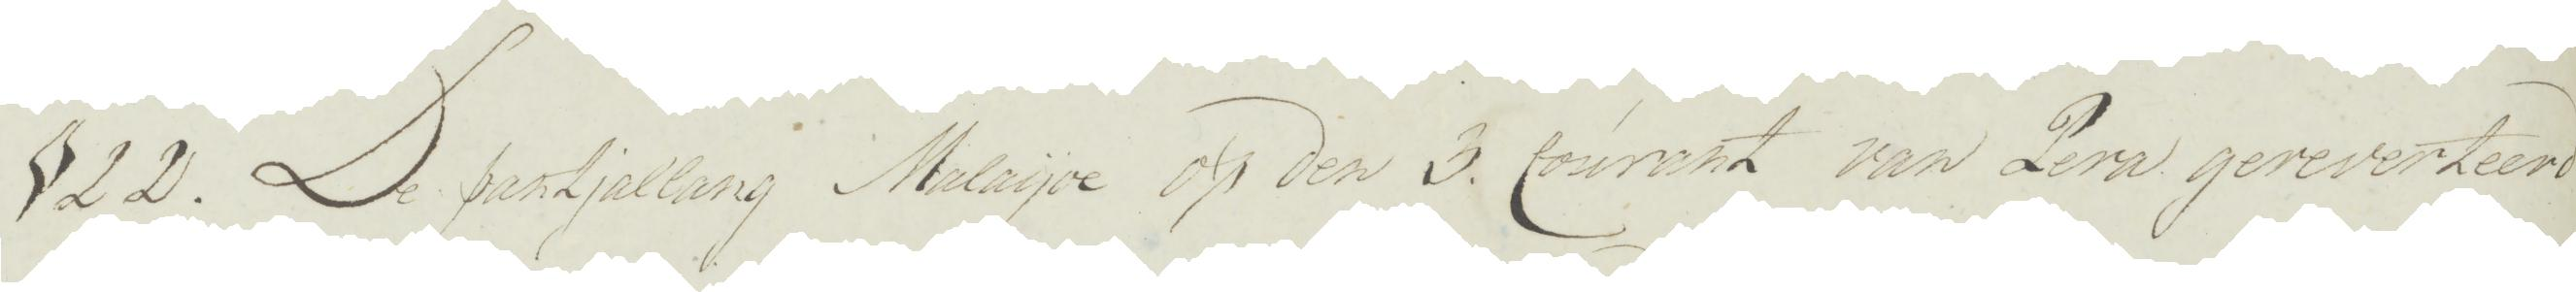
§ 22. De pantjallang Malaijoe op den 3. Courant van Pera gereverteerd
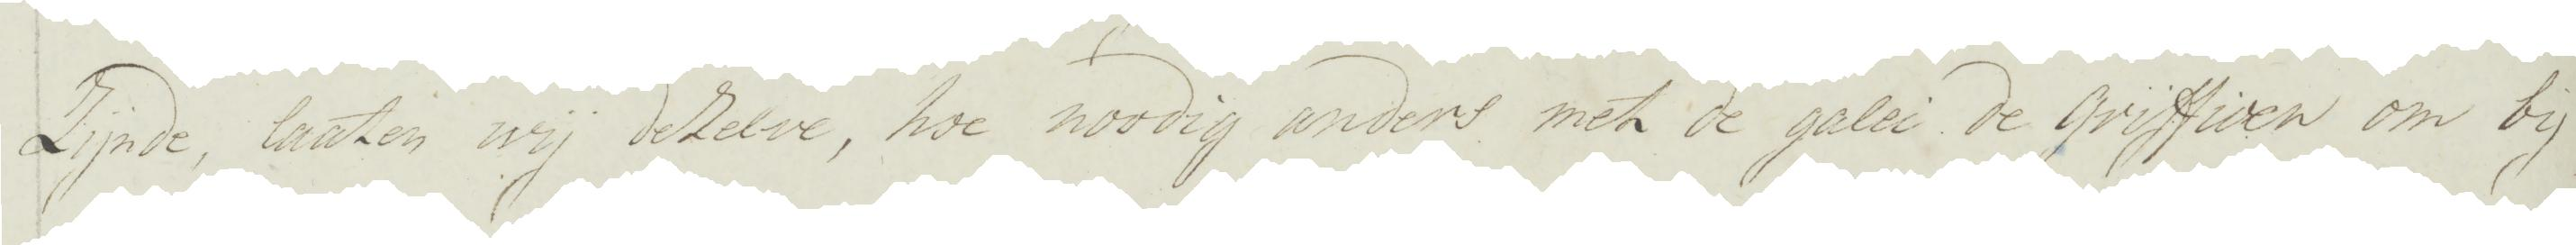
Zijnde, laaten wij dezelve, hoe noodig anders met de galei de griffioen om bij
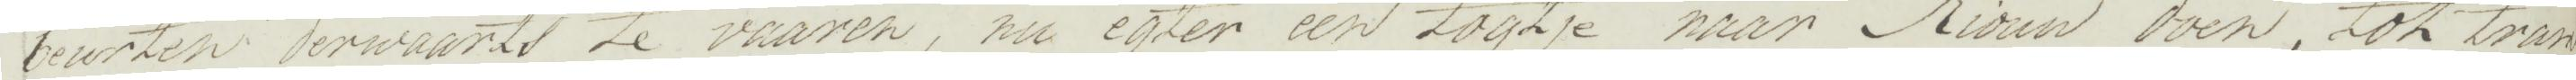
beurten derwaarts te vaaren, nu egter een togtje naar Riouw doen, tot tran
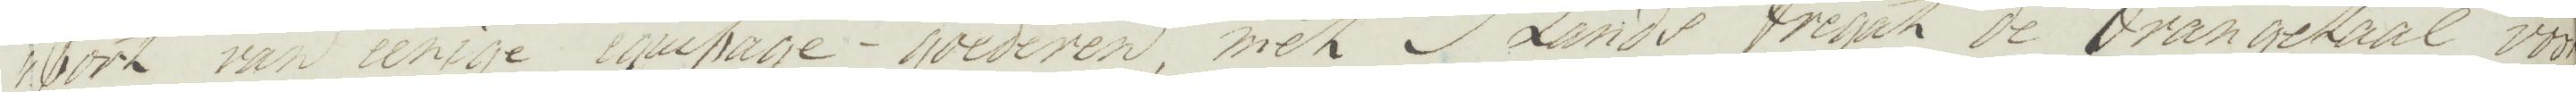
„port van eenige equipage-goederen, met 'S Lands fregat de Orangezaal voor
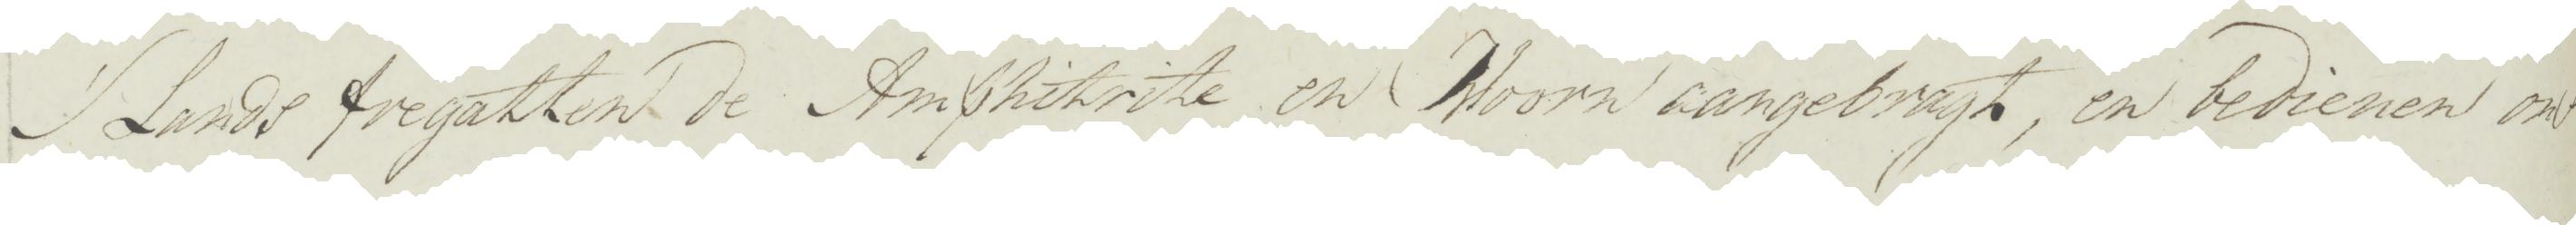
'S Lands fregatten de Amphitrite en Hoorn aangebragt, en bedienen ons
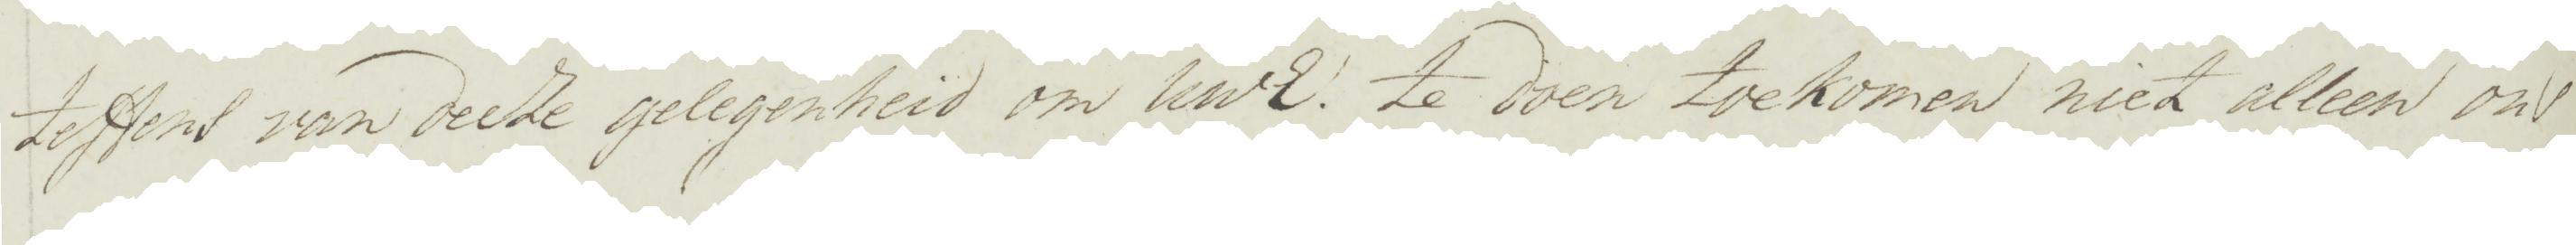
teffens van deeze gelegenheid om uw E. te doen toekomen niet alleen ons
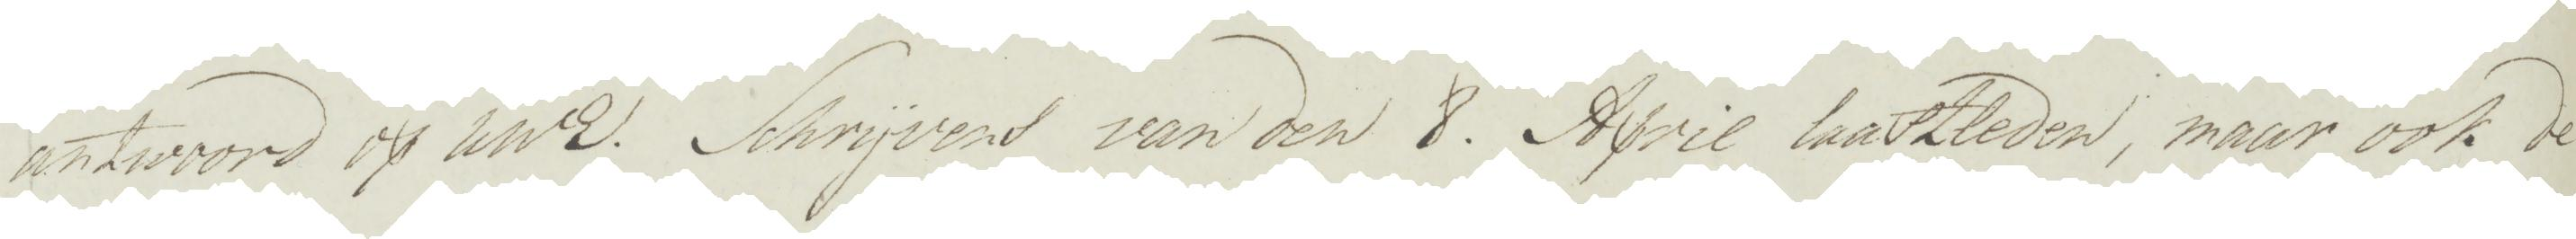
antwoord op uwE. Schrijvens van den 8. April laastleden, maar ook de
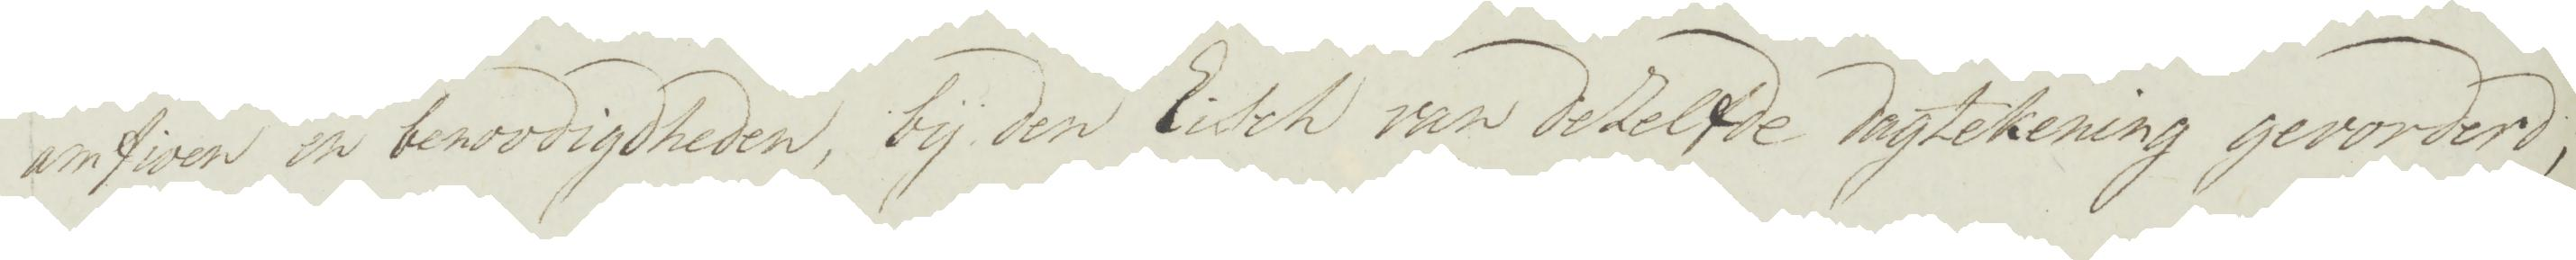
amfioen en benoodigdheden, bij den Eisch van dezelfde dagtekening gevorderd,
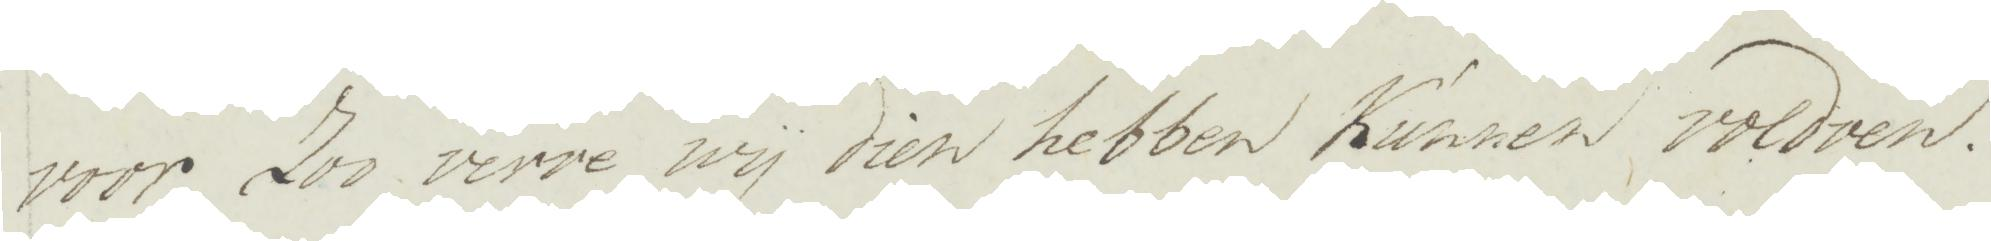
voor Zoo verre wij dien hebben Kunnen voldoen.
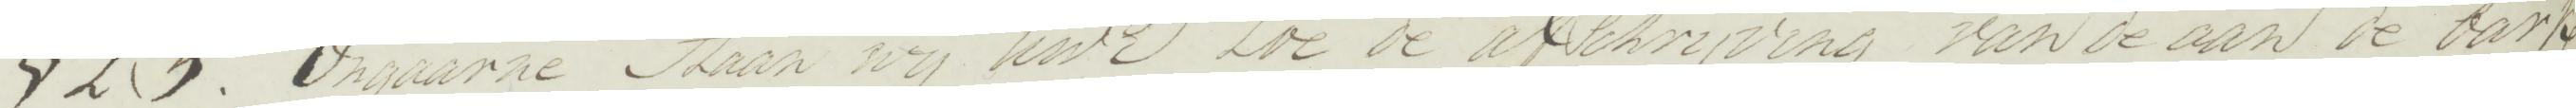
§ 23. Ongaarne staan wij uw E toe de afschrijving van de aan de bark
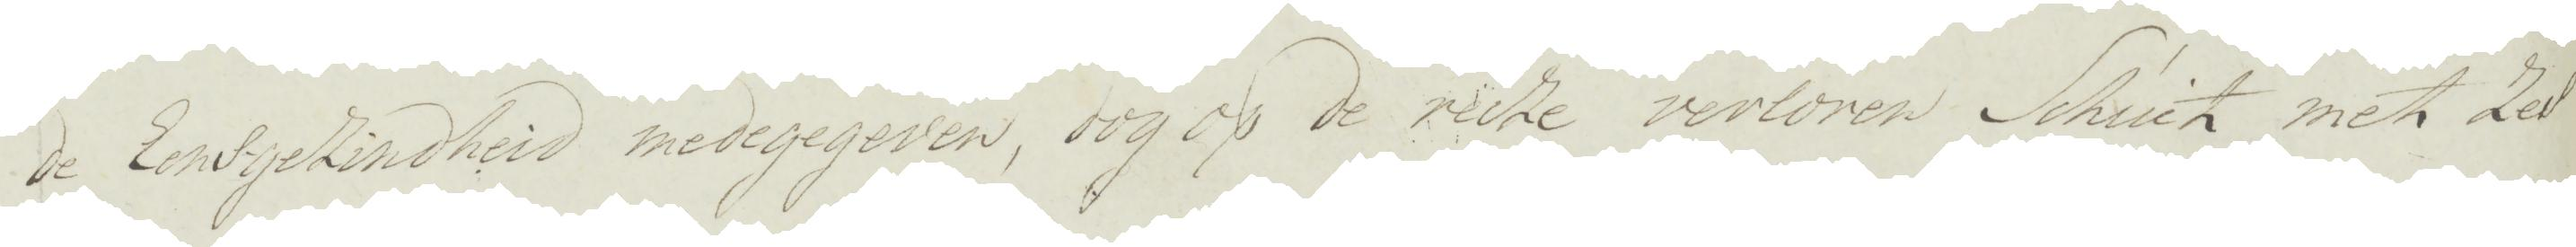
de Eensgezindheid medegegeven, dog op de reize verloren Schuit met Zes
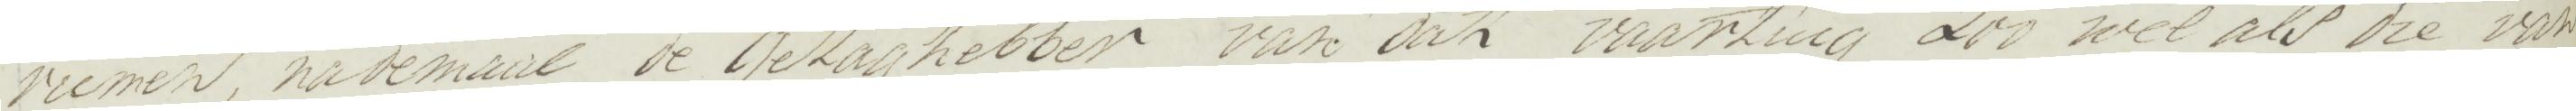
riemen, nademaal de Gezaghebber van dat vaartuig Zoo wel als die van
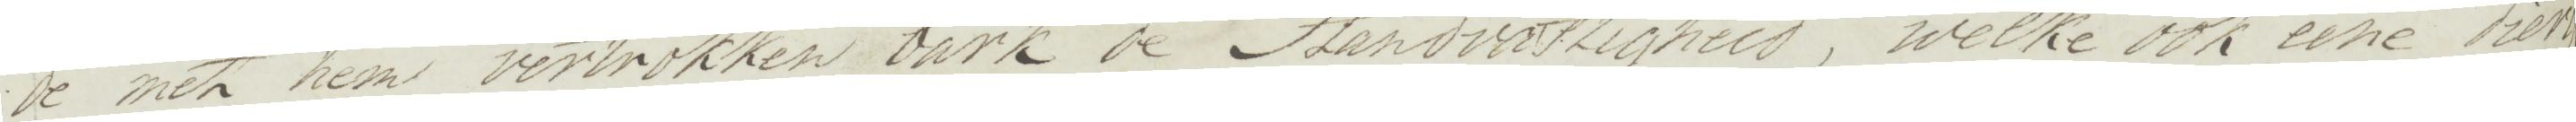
de met hem vertrokken bark de Standvastigheid, welke ook eene dierg
